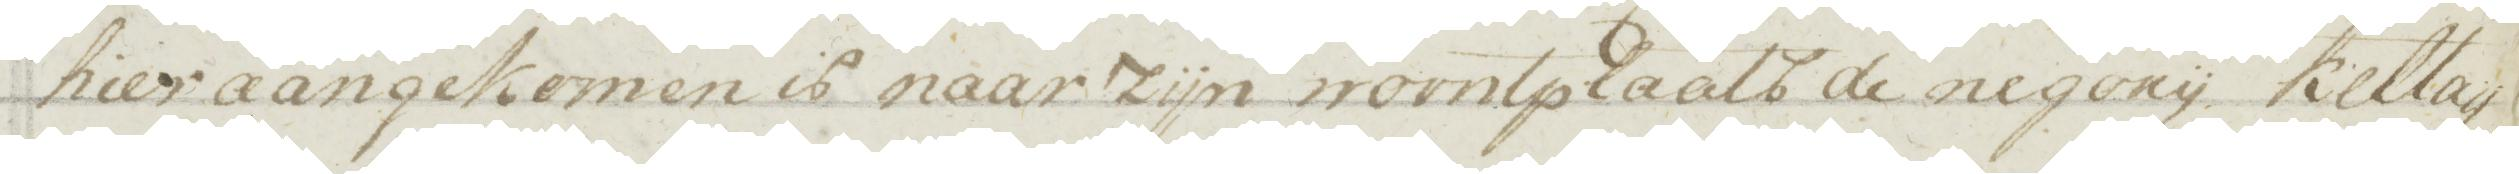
hier aangekomen is naar zijn woontplaats de negorij keltaij
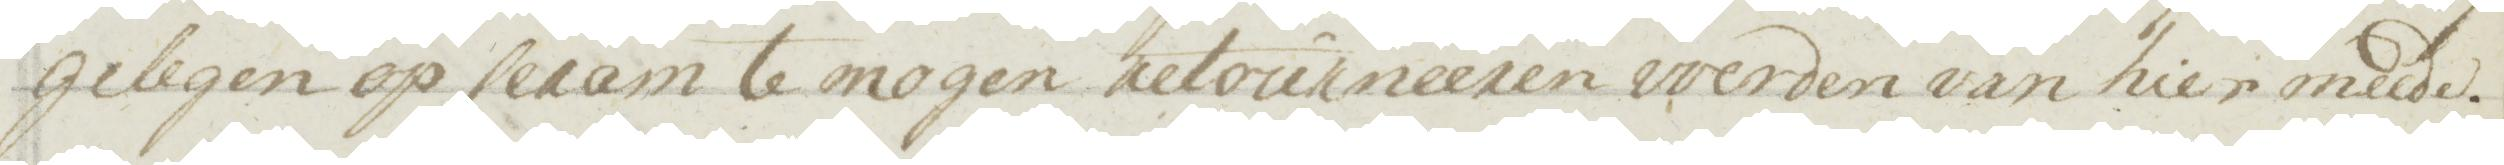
gelegen op Ceram te mogen retourneeren voerden van hier meede.
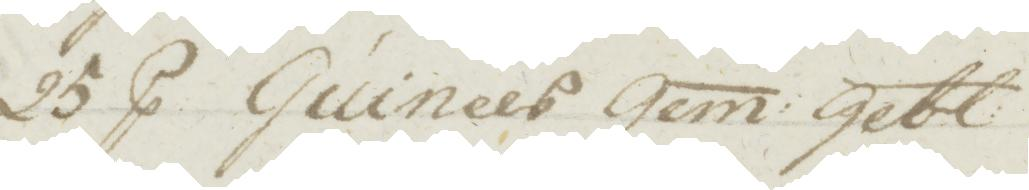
25 p:s Guinees gem: gebl:
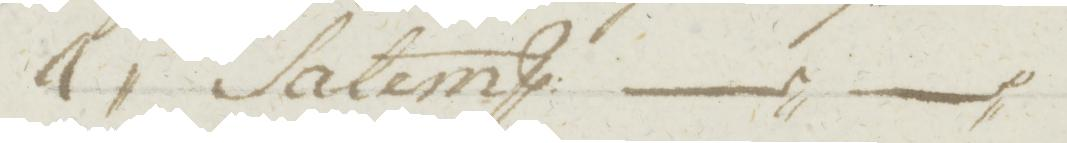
4 „ Salemp: _„ _„
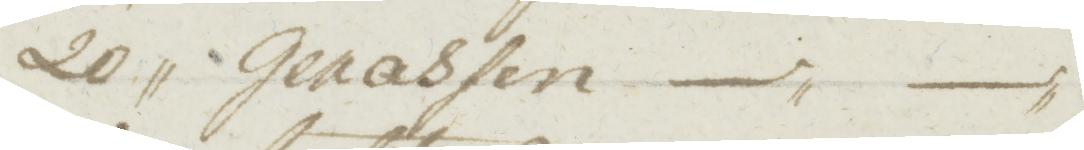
20 „ gerassen _„ _„
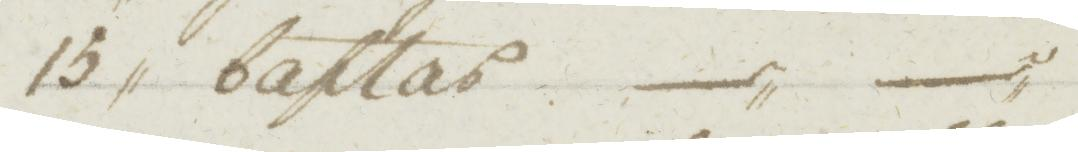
15 „ baftas _„ _„
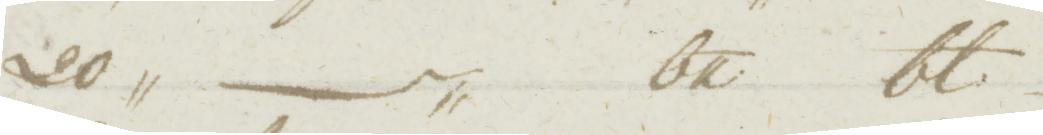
20 „ _„ br: bl:
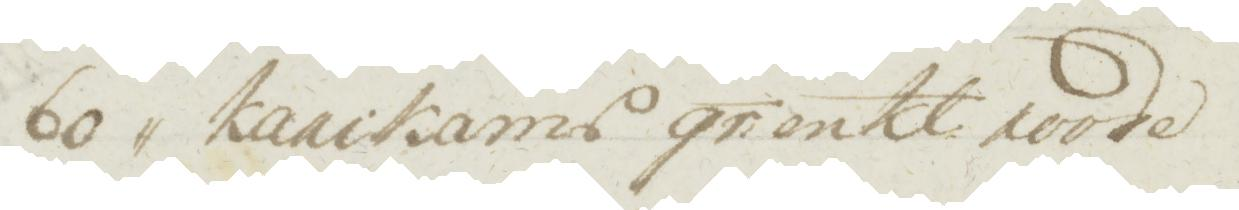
60 „ karikams gr: enkl. roode
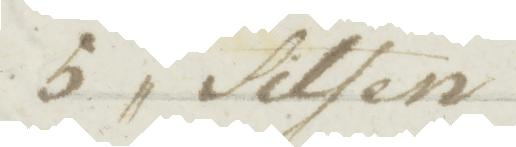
5 „ sitsen
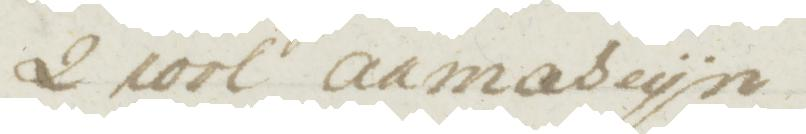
2 rool armoseijn
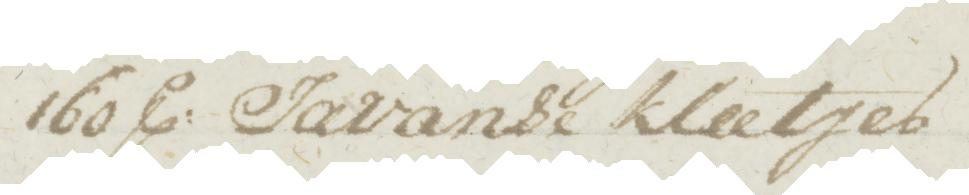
160 p:s Iavanse kleetjes
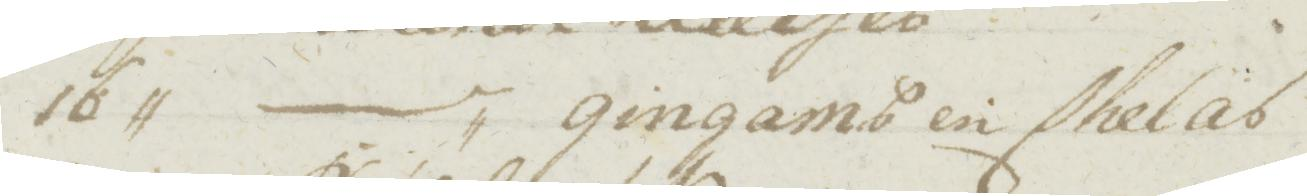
16 „ _„ gingams en Chelas
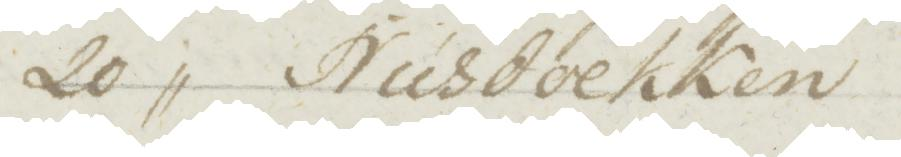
20 „ Nusdoekken
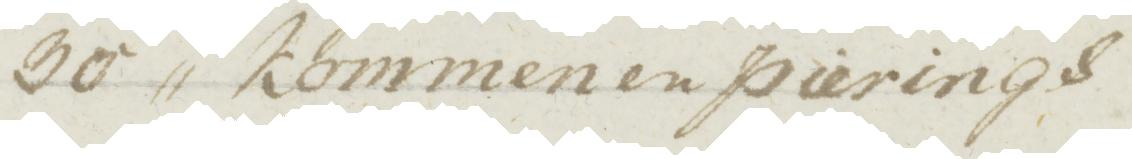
30 „ kommen en pierings
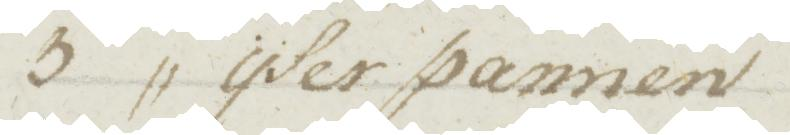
3 „ ijser pannen
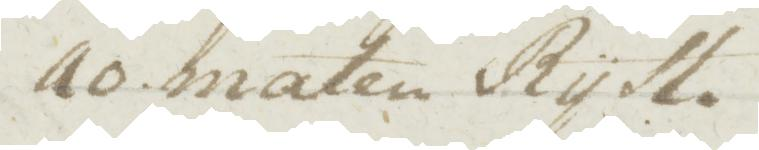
40. maten Rijst.
